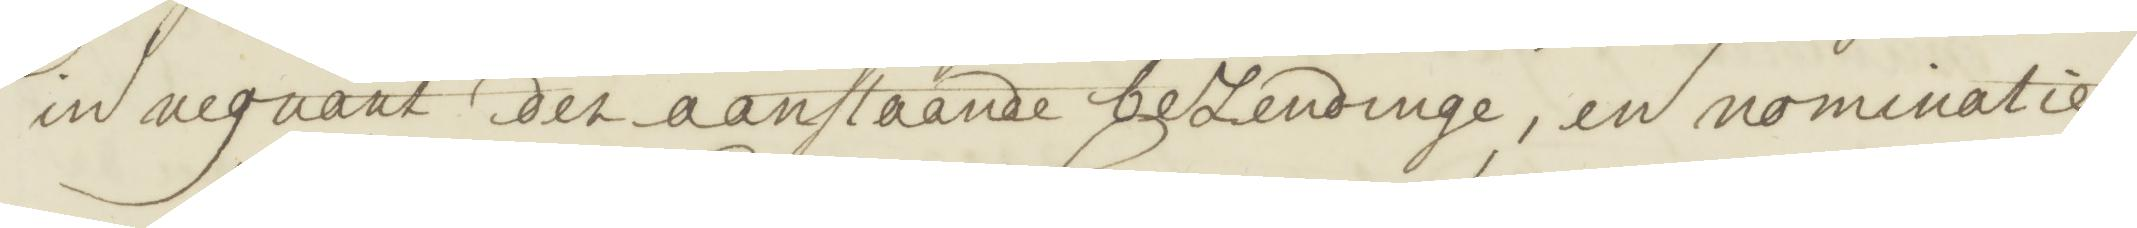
in reguart der aanstaande bezendinge, en nominatie
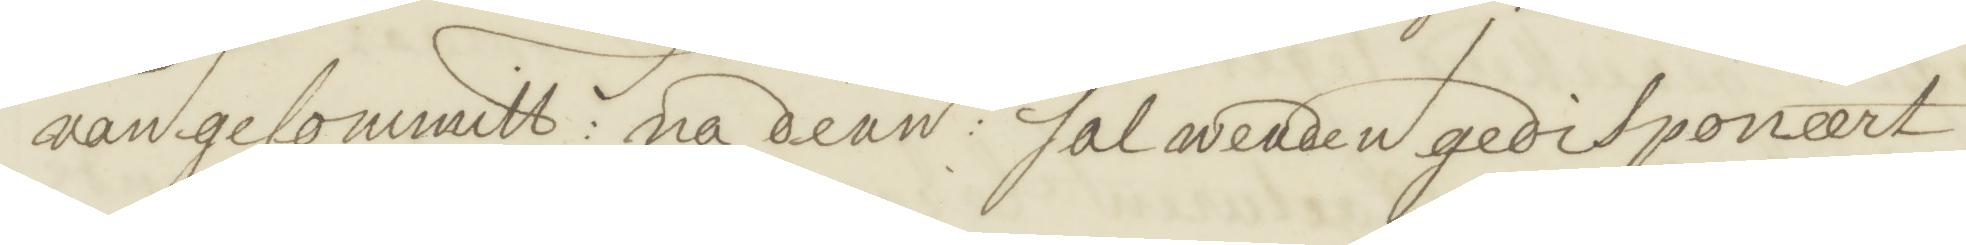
van gecommitt:s na derw:s sal werden gedisponeert
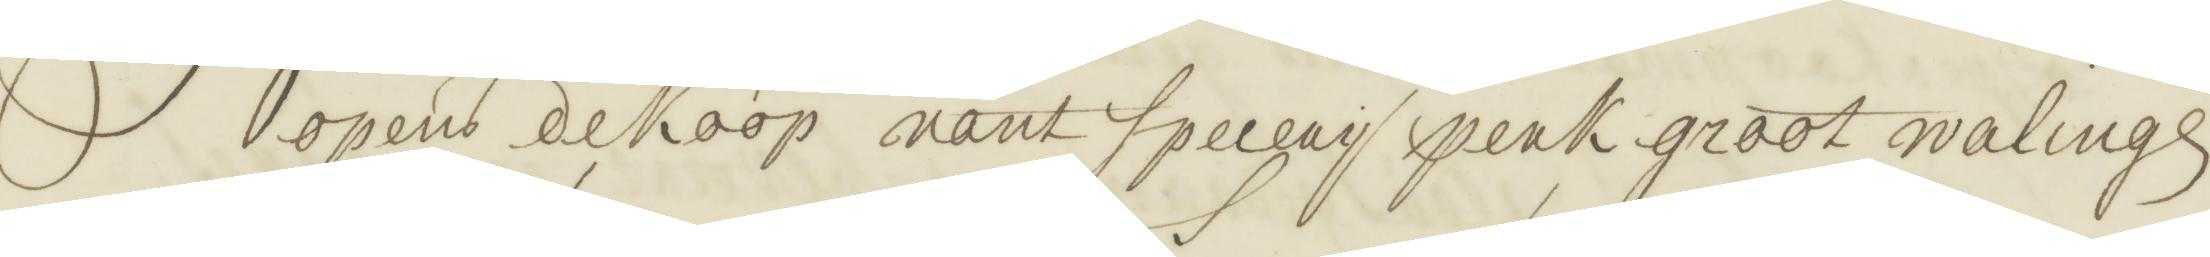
Nopens de Koop van't specerij perk groot walinge
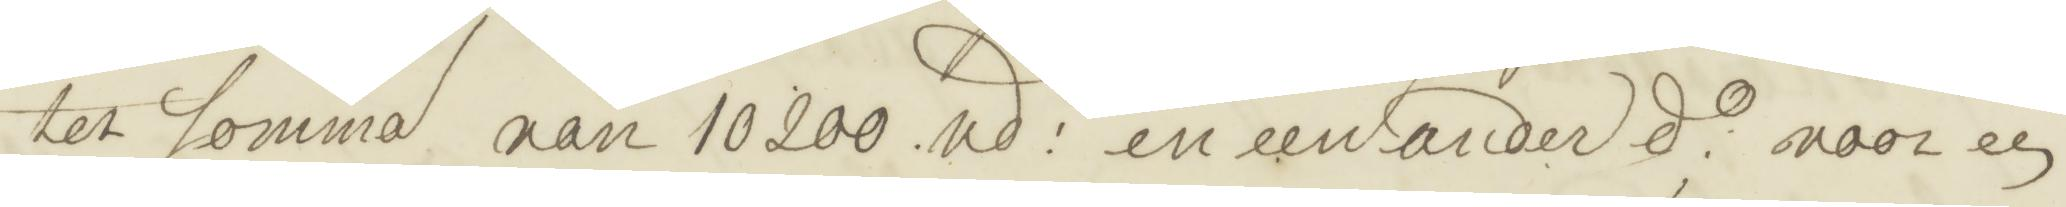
ter somma van 10200. rd:s en een ander d:o voor een
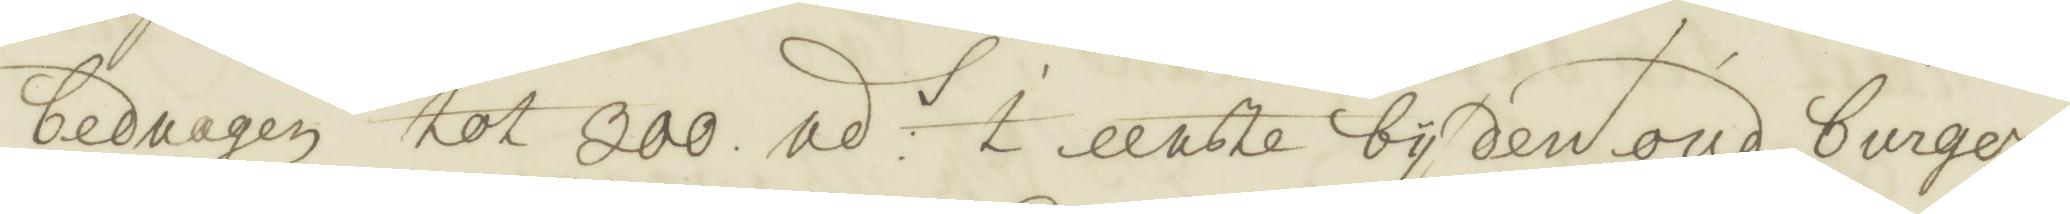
bedragen tot 300. rd:s t' eerste bij den oud burger
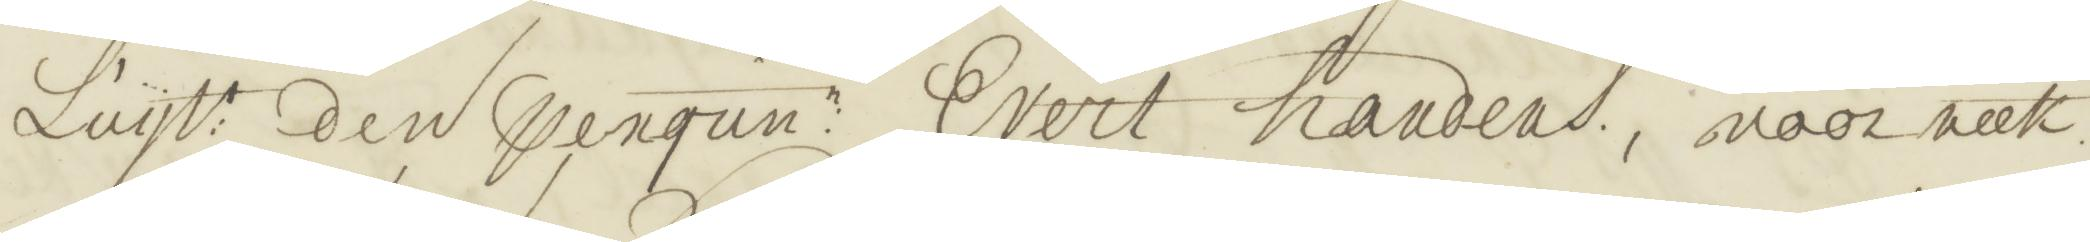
Luijt:t der perqun:r Evert harders., voor reek
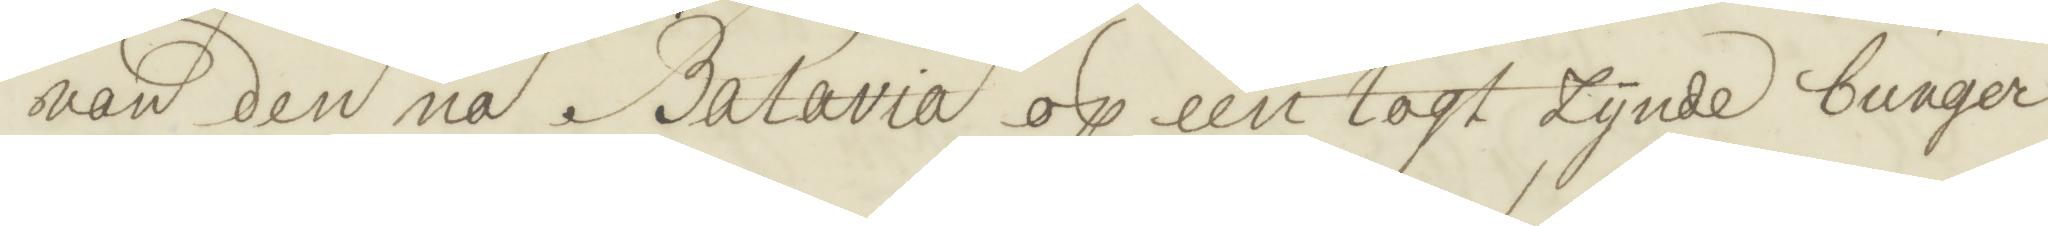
van den na Batavia op een togt zijnde burger
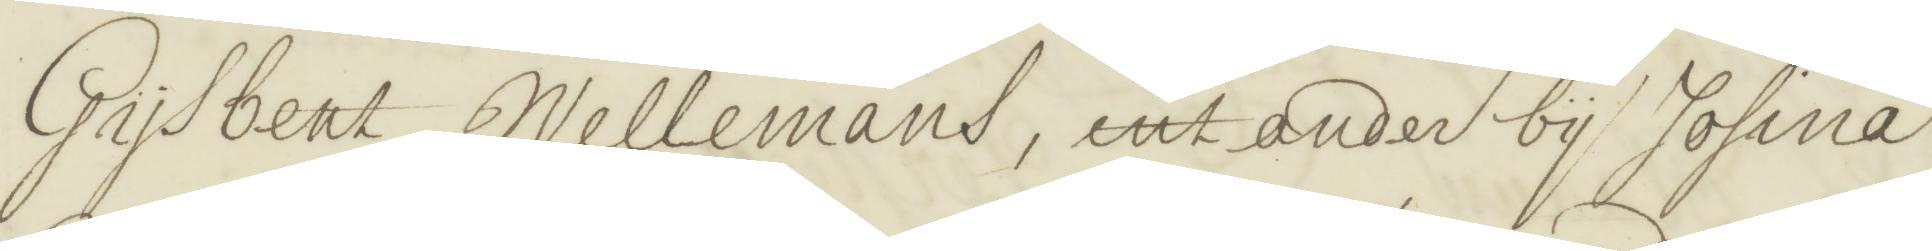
Gijsbert Wellemans, en't ander bij Josina
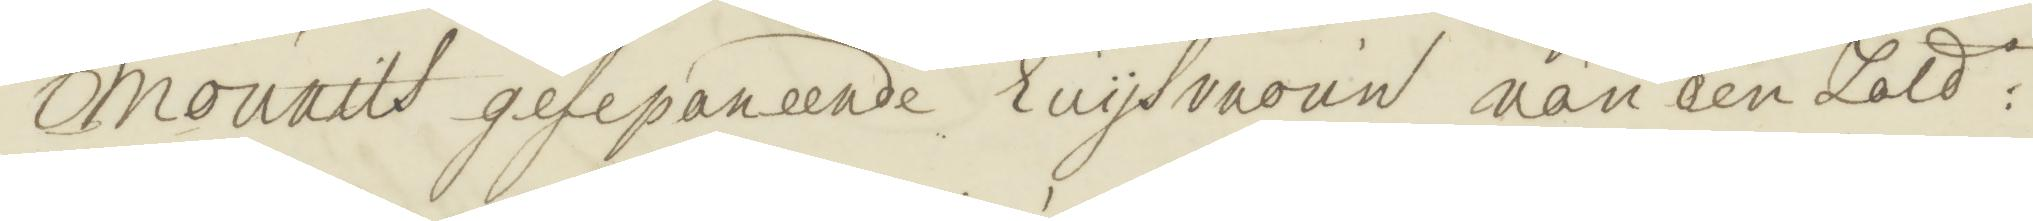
mourits gesepareerde huijsvrouw van den zold:
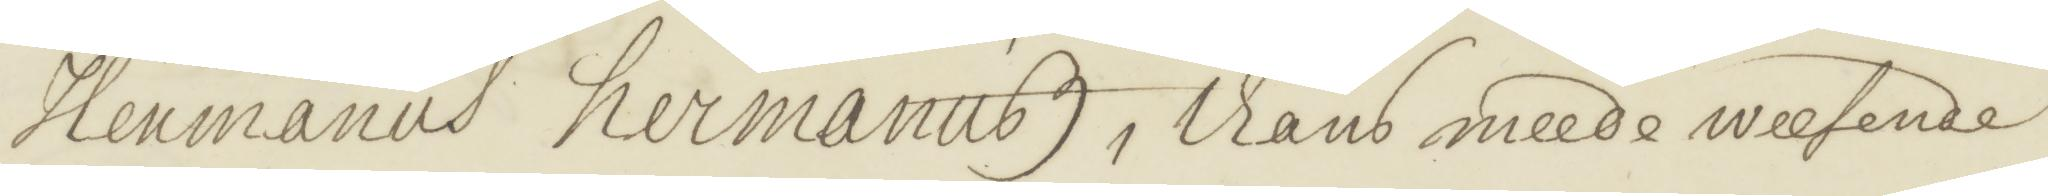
Hermanus Hermanusz, thans meede weesende
